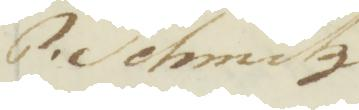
P. Schmitz
